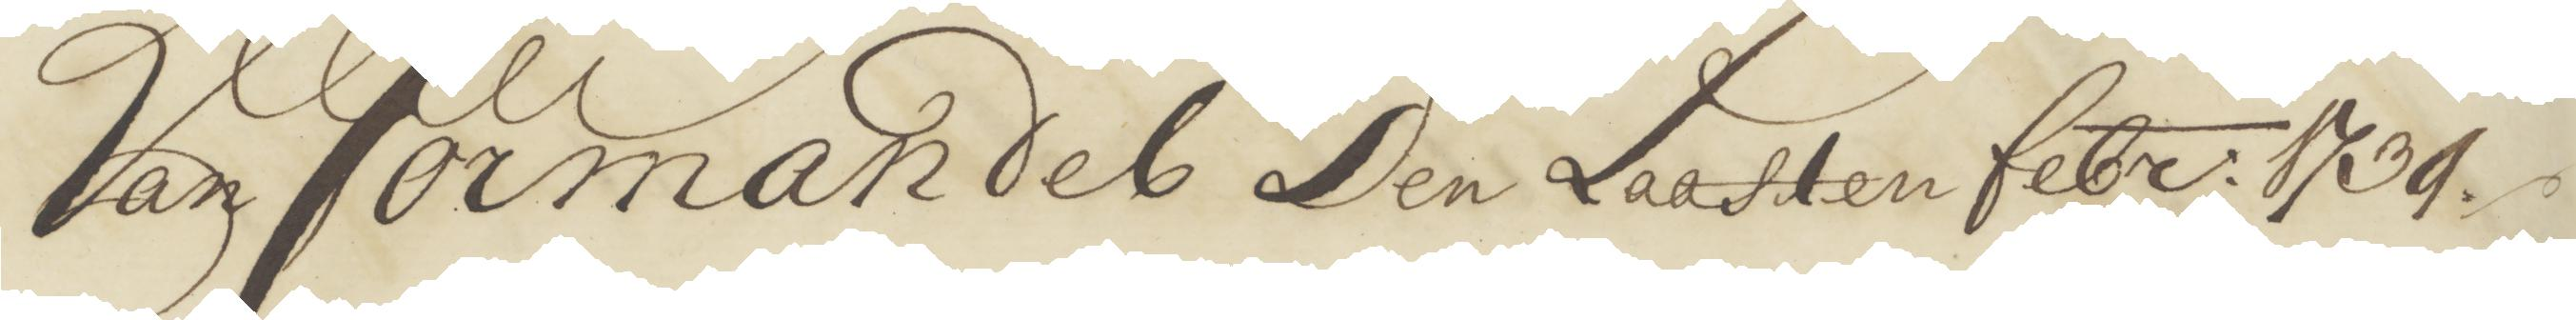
Van Cormandel Den Laasten febr: 1734.
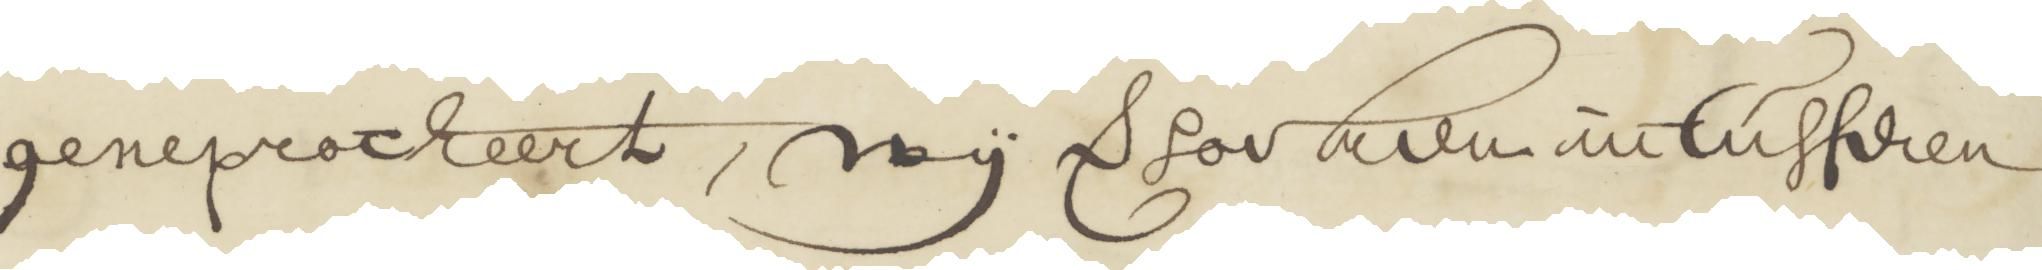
geneprocheert, wij versoeken intusschen
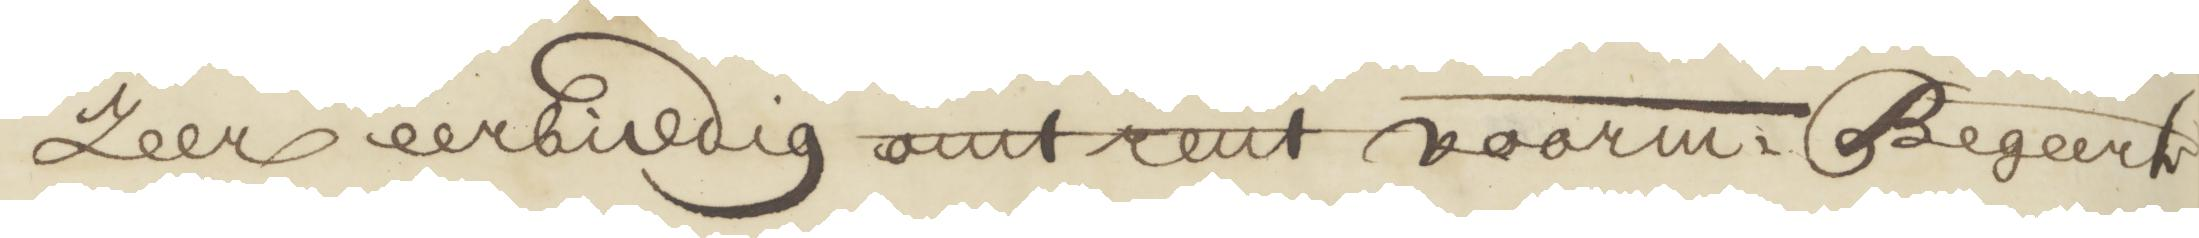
zeer eerbiedig omtrent voorm: Begeerte
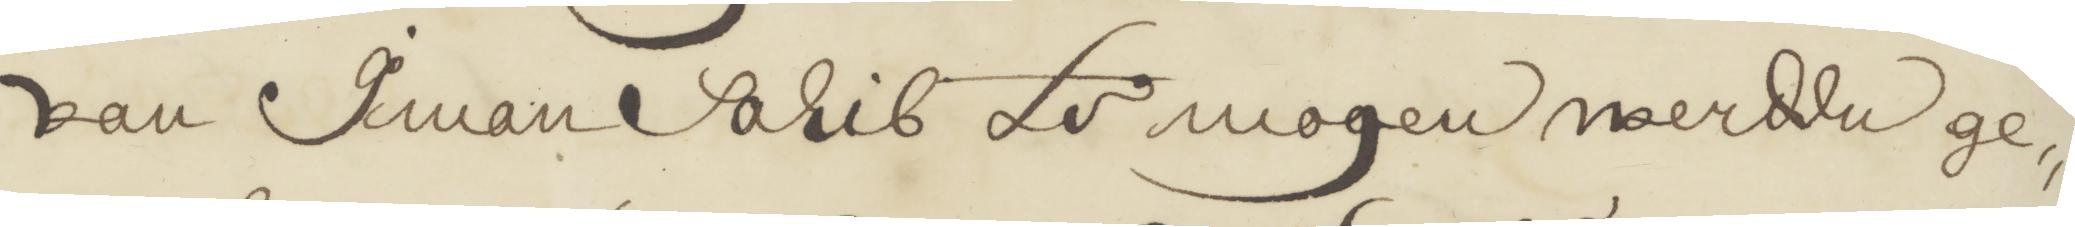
van Iman Sahib te mogen werden ge„
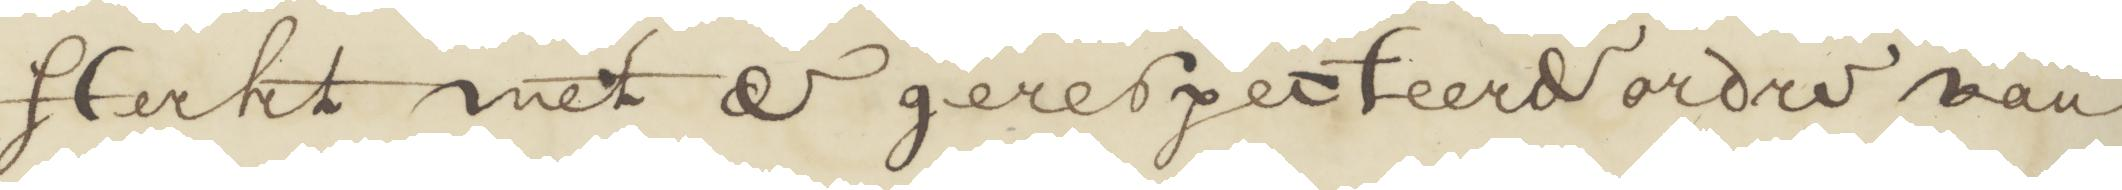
sterkt met de gerespecteerde ordre van
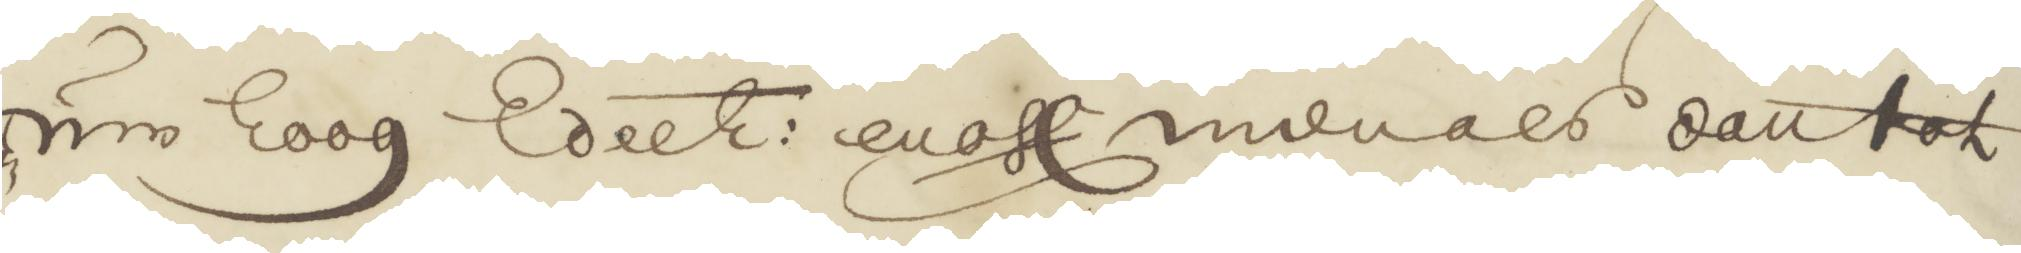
uw hoog Edelh: en off men als dan tot
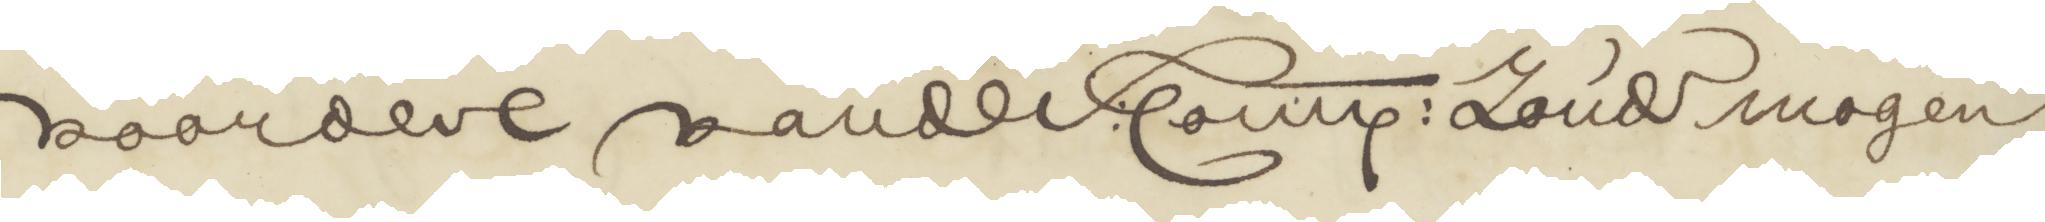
voordeel van de E: Comp: zoude mogen
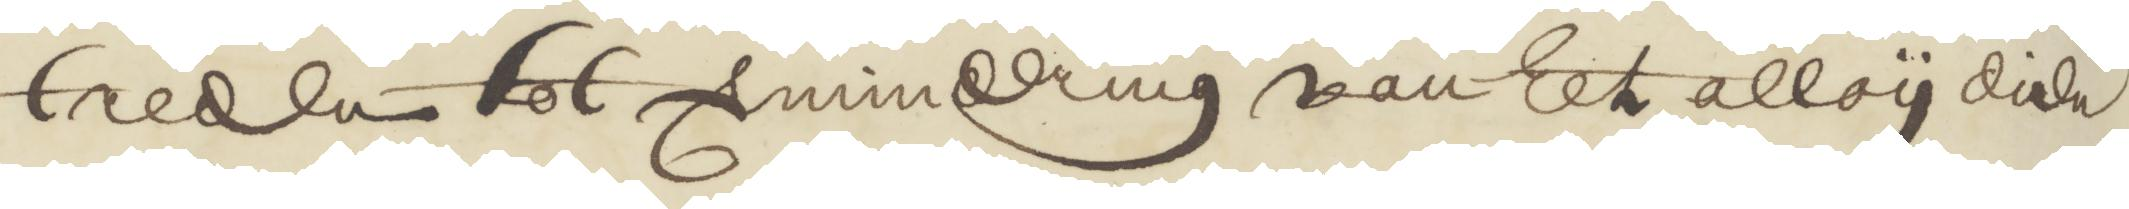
treden tot vermindering van het alloij dien
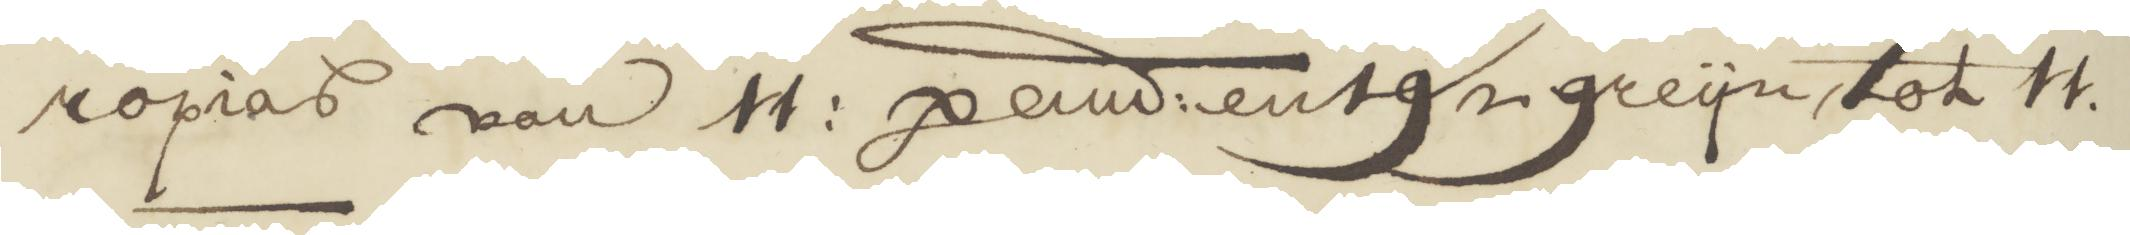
ropias van 11: penn: en 19½ greijn, tot 11.
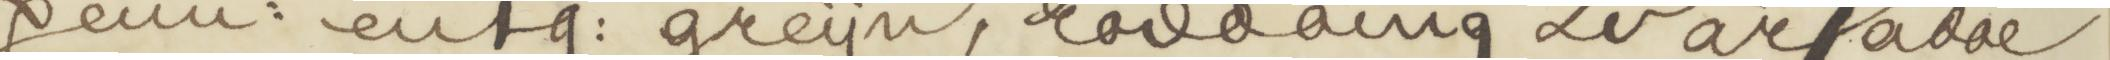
penn: en 14: greijn, hoedanig te arcadoe
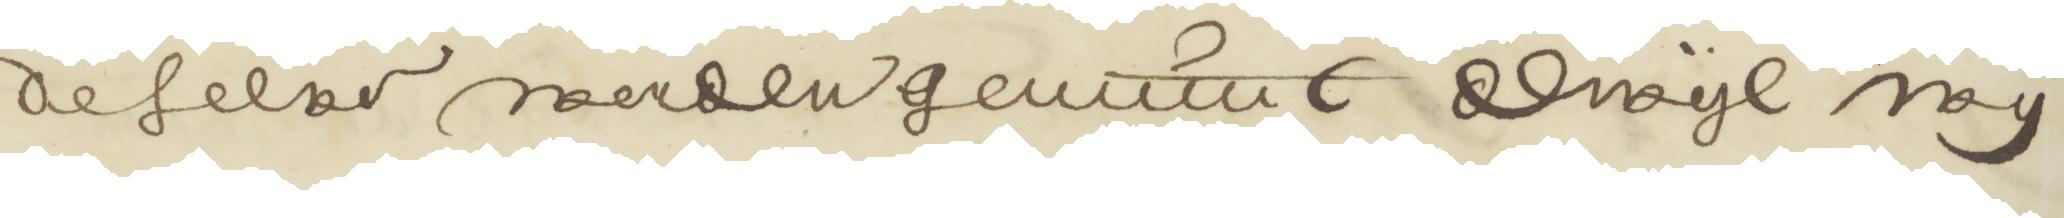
deselve werden gemunt dewijl wij
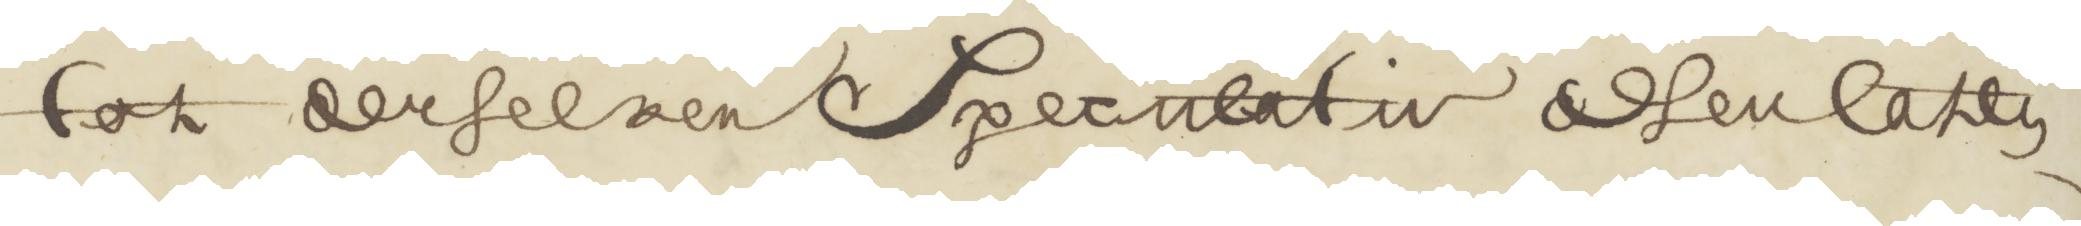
tot derselver speculatie desen laten
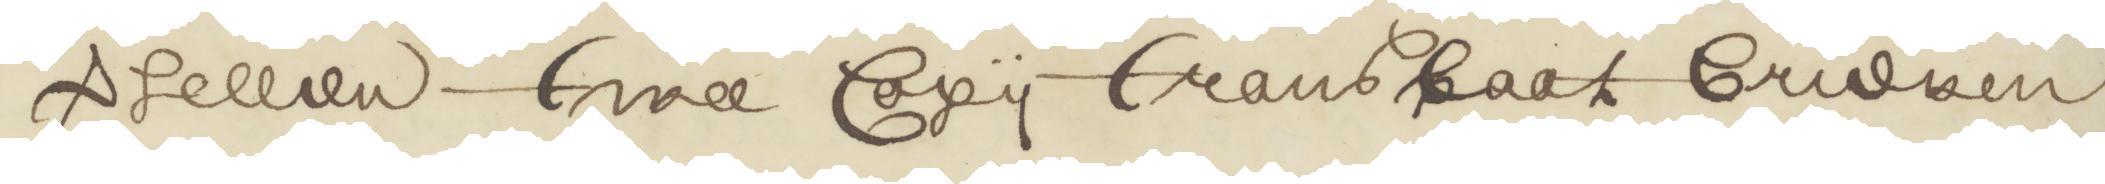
versellen twee Copij translaat brieven
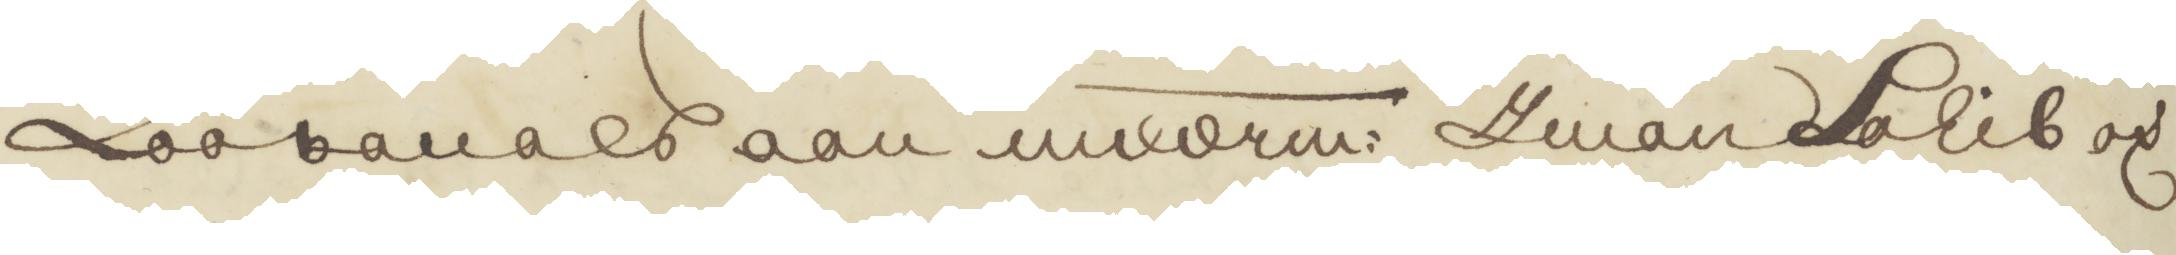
zoo van als aan meerm: Iman Lohib over
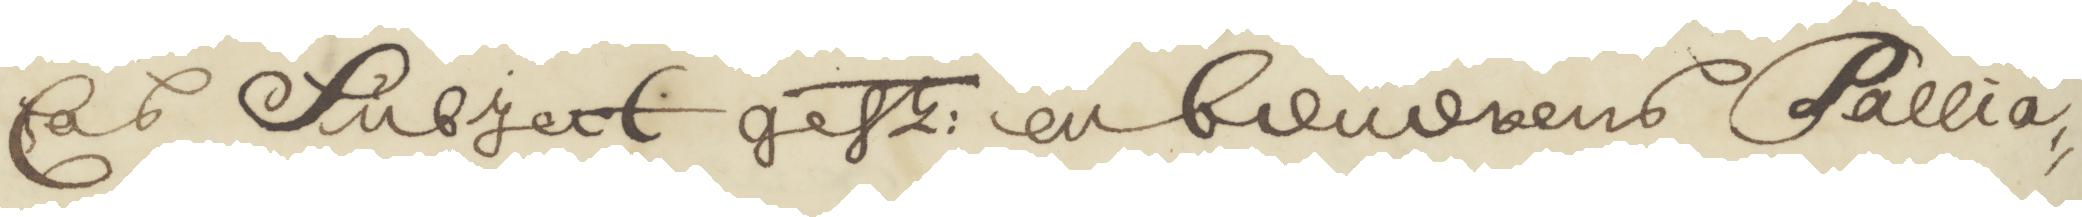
cas subject gesz: en benevens Pallia„
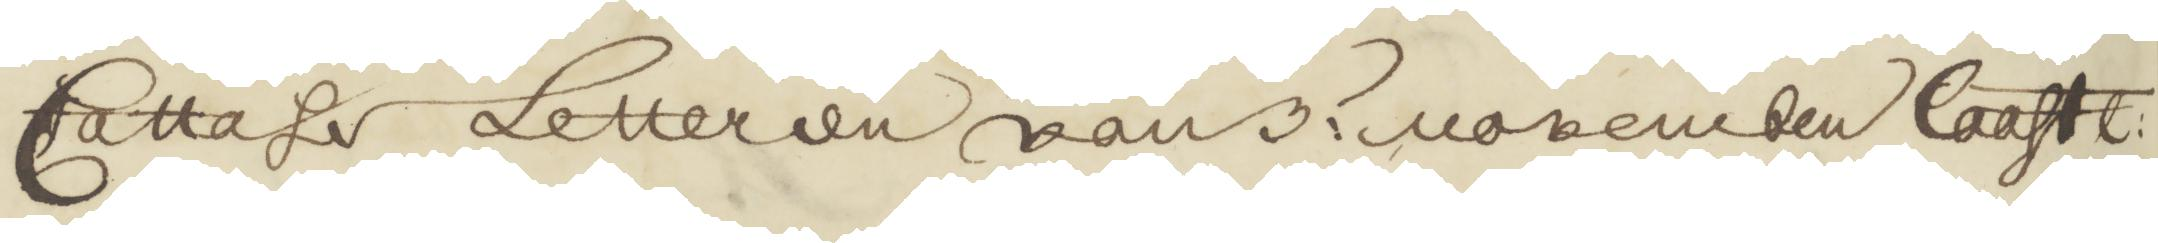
cattase letteren van 3:' november laastl:
